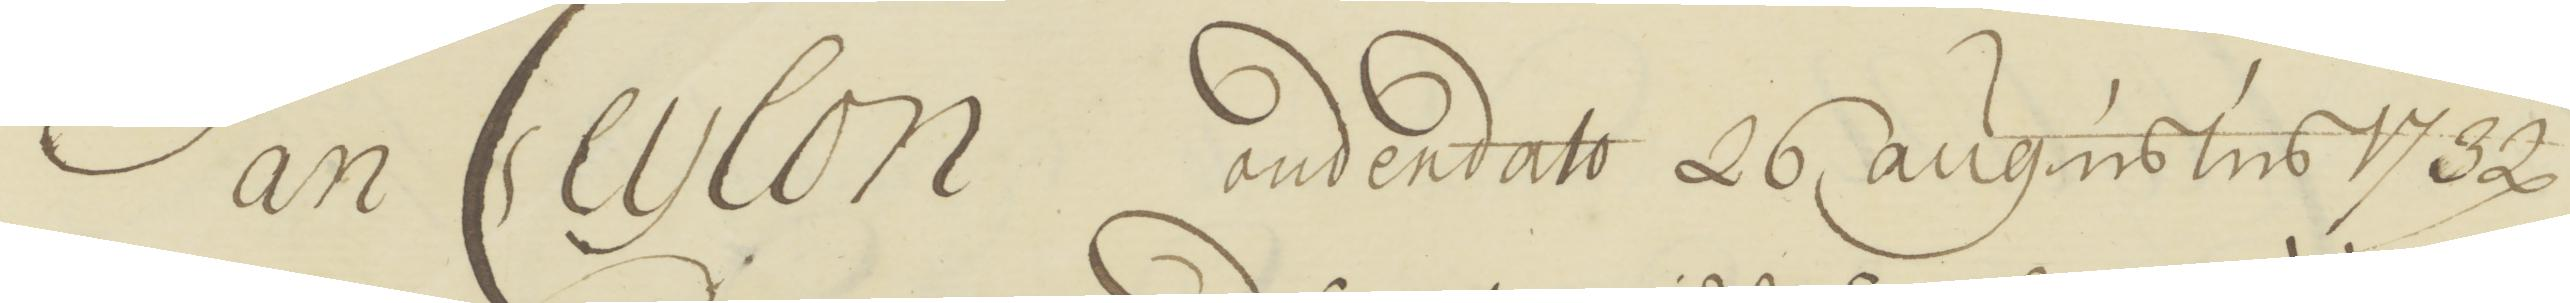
Van Ceylon onderdato 26 augustus 1732
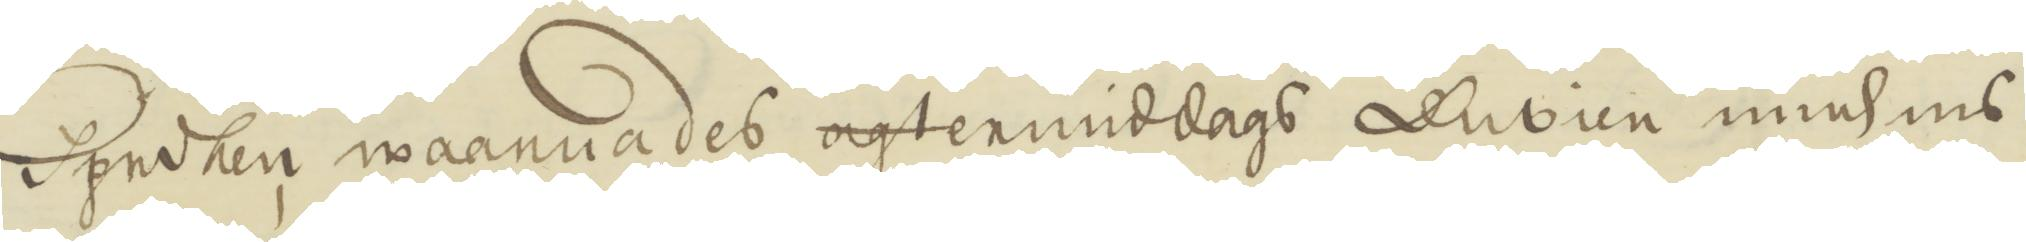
spreken waarna des agtermiddags ten vier uuren ins
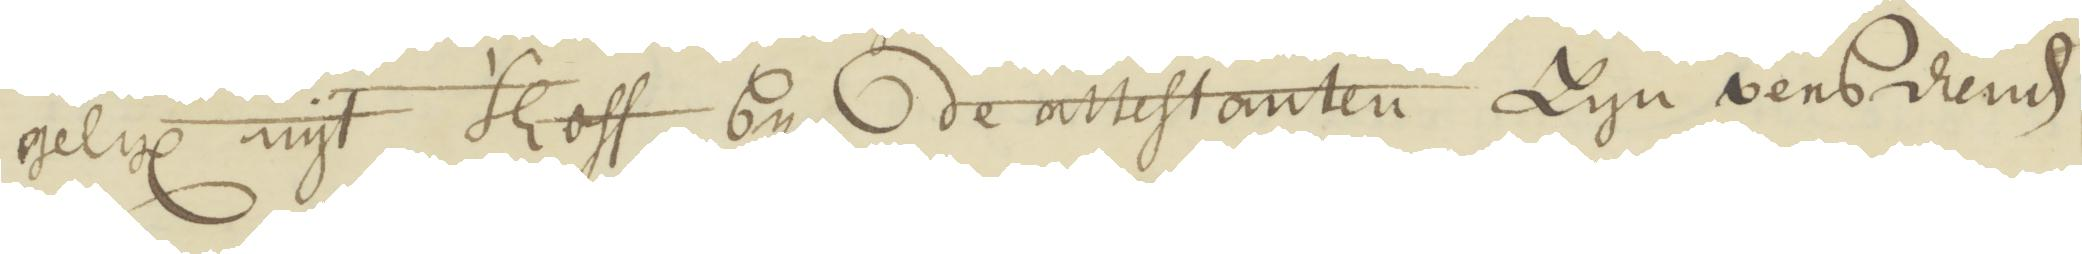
gelyx uijt 'thoff by de attestanten Zyn verschenen
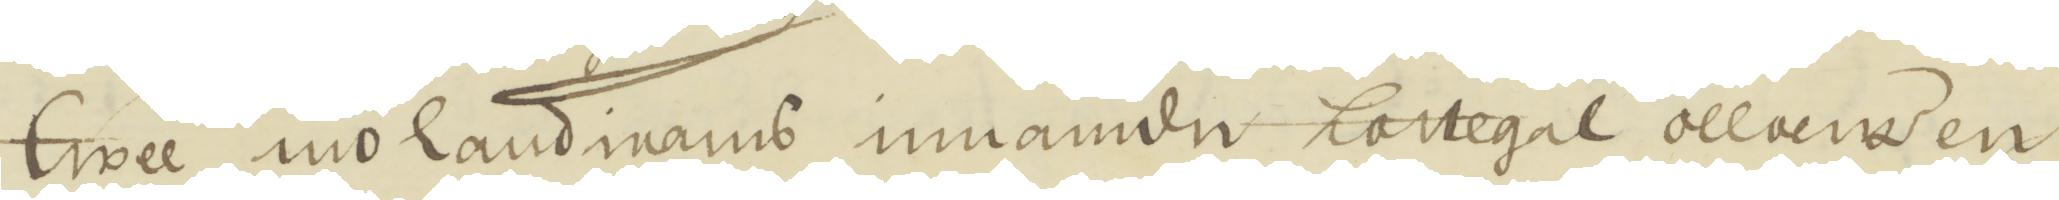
twee mohandirams innamen kottegal olloewe en
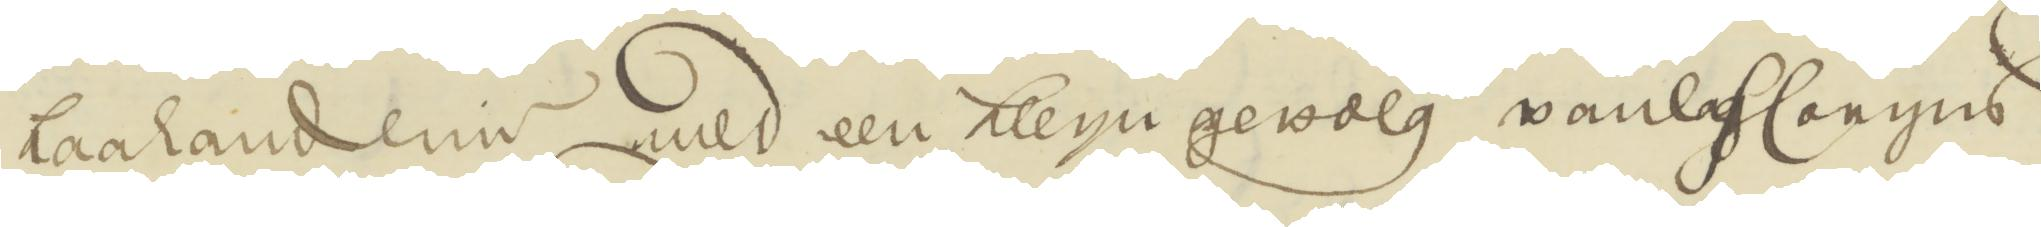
kaahandenie med een kleyn gevolg van lascoryns
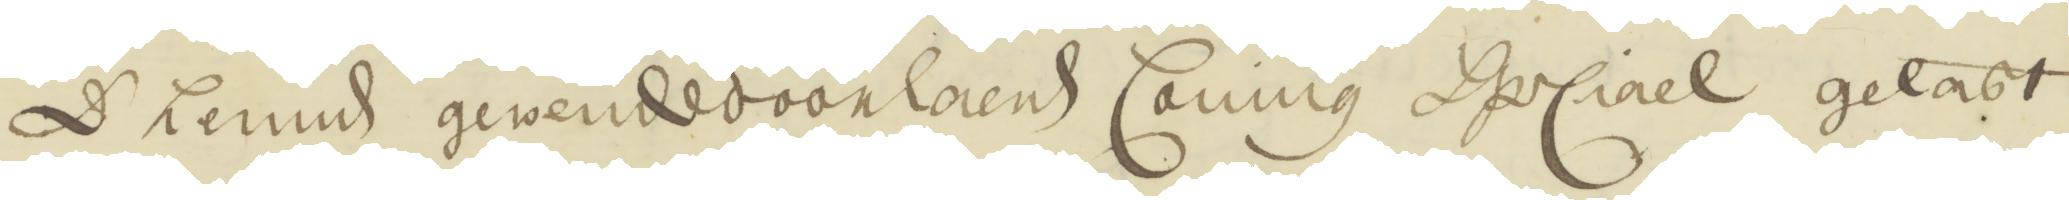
te kennen gevende doorhaeren Coning speciael gelast
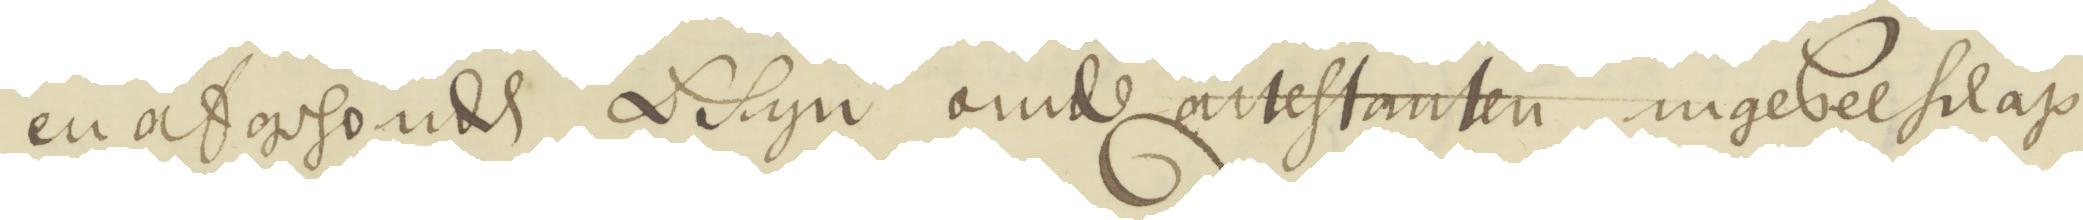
en afgesonden te syn omde attestanten in geselschap
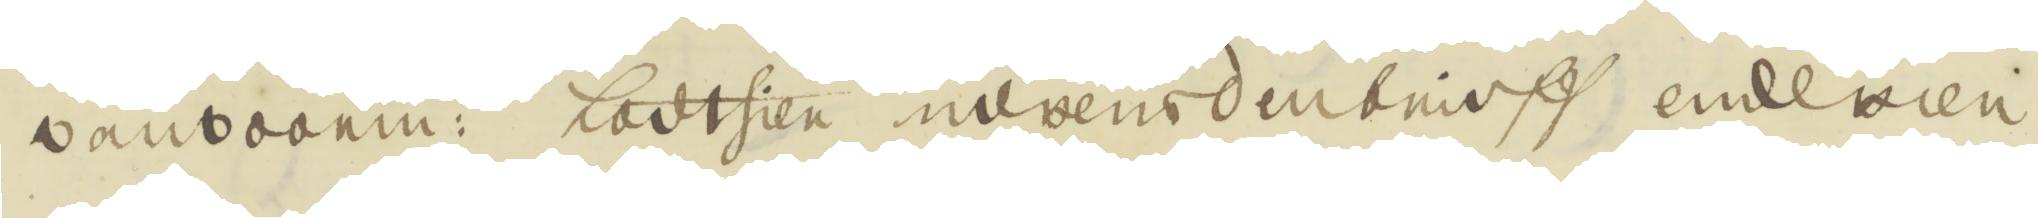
van voorm: koetsier nevens den brieff ende vier
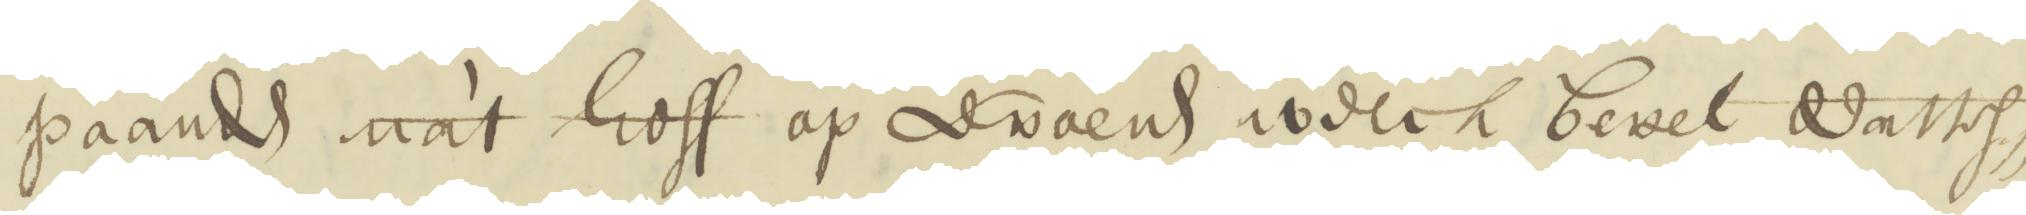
paarden na’t hoff op tevoeren welck bevel de attes„
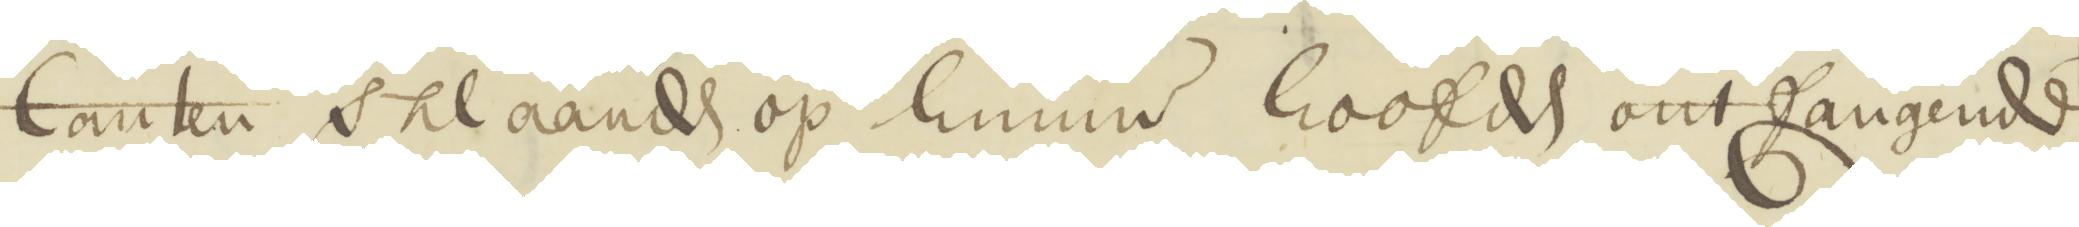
tanten verklaarden op hunne hoofden ontfangende
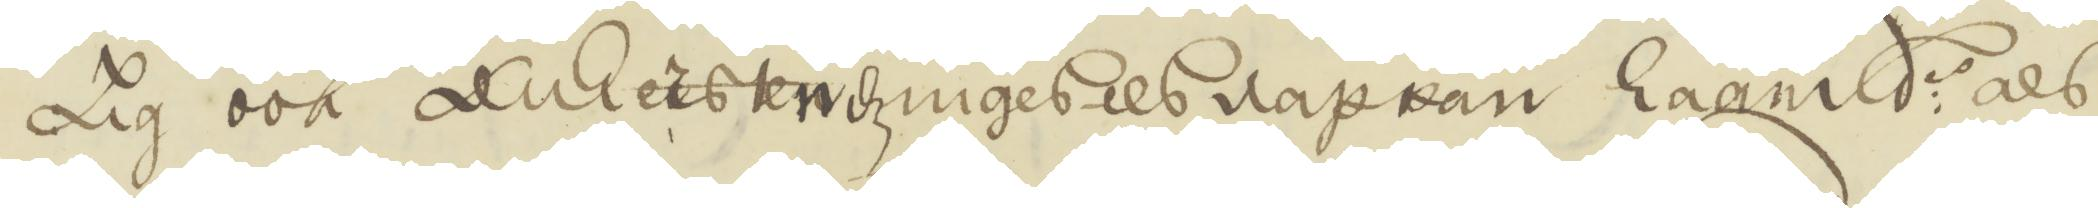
Zig ook ten Eersten en ingeselschap van haar Ed:s als
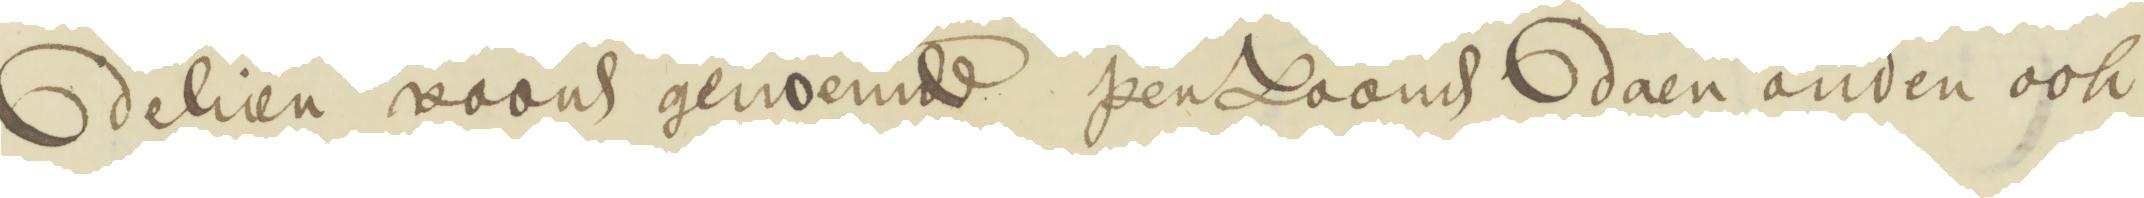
de hier vooren genoemde perzoonen daer onder ook
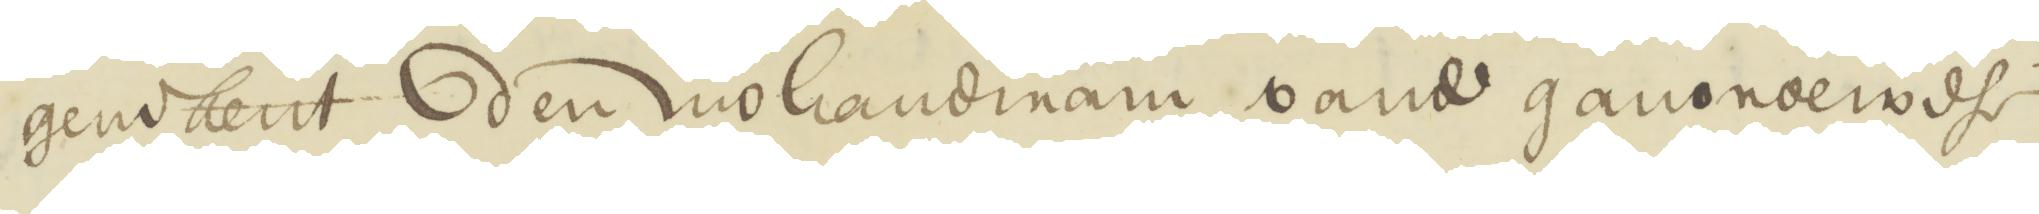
gerekent den mohandiram vande ganoroewese
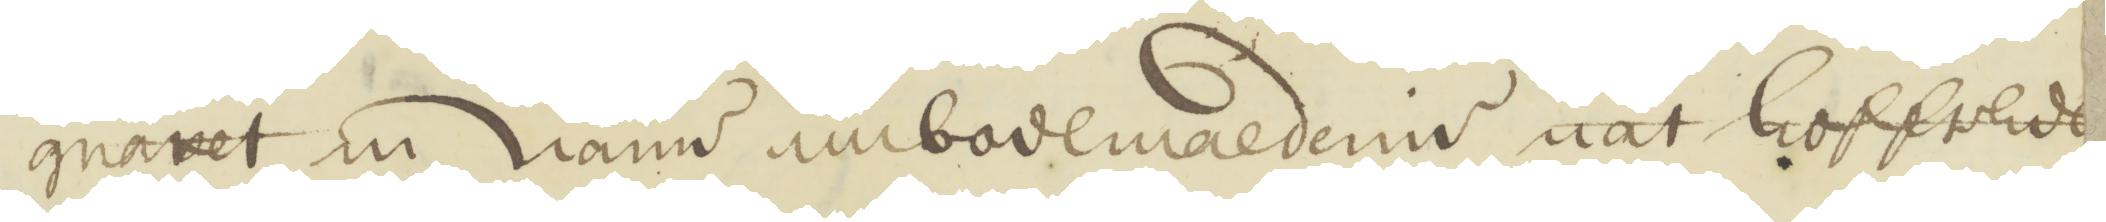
gravet in name imboelmaldenie na't hoff te hel
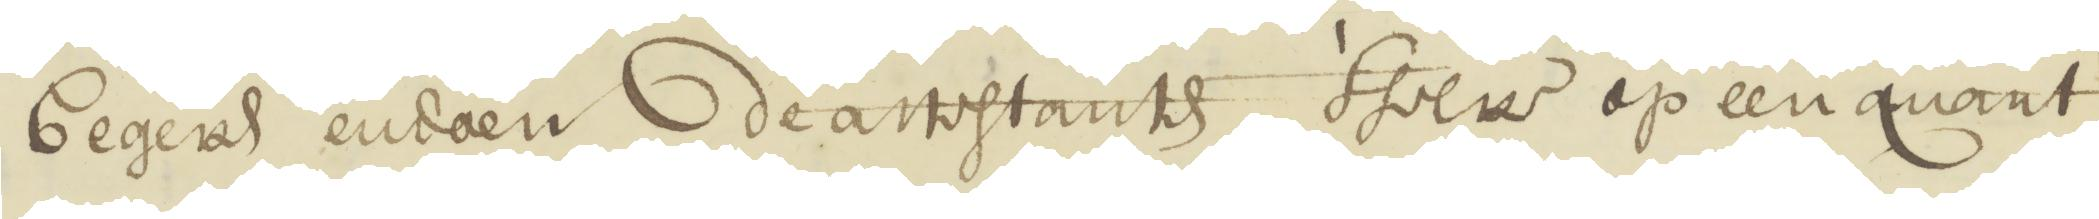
begeven en doen de attestanten 'tselve op een quart
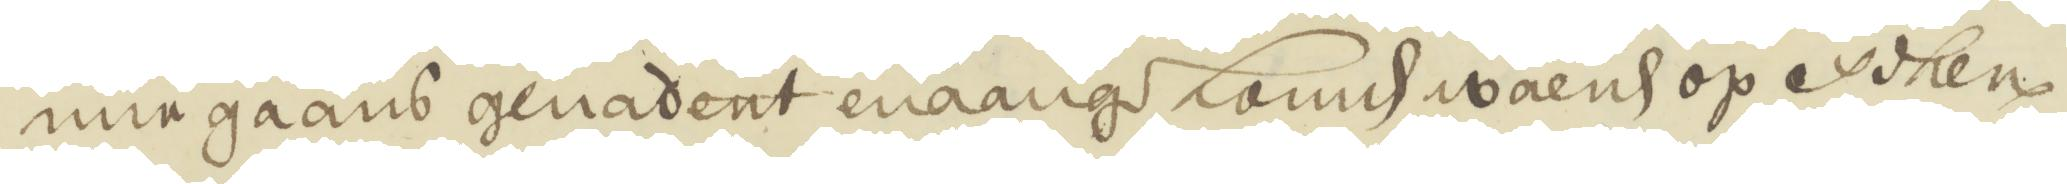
uur gaans genadert en aangekomen waeren op seker
